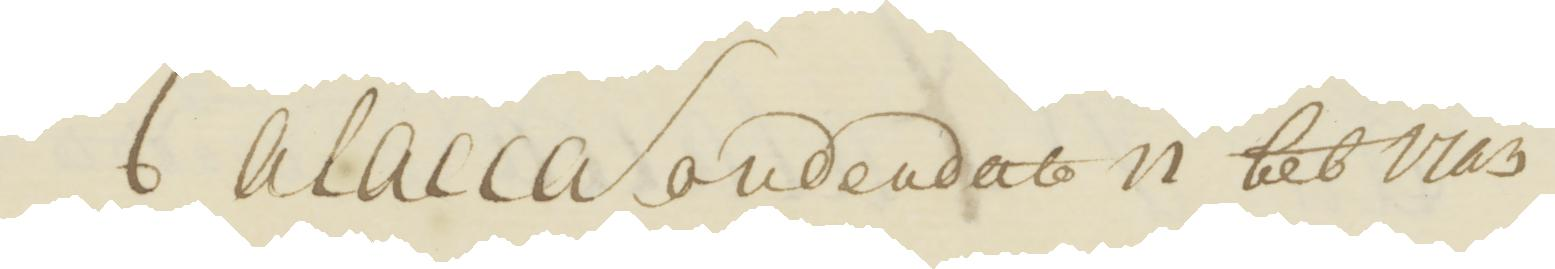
alacca onderdato 11 feb 1743
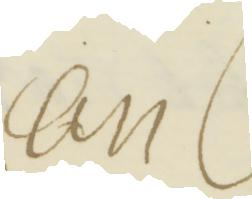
an
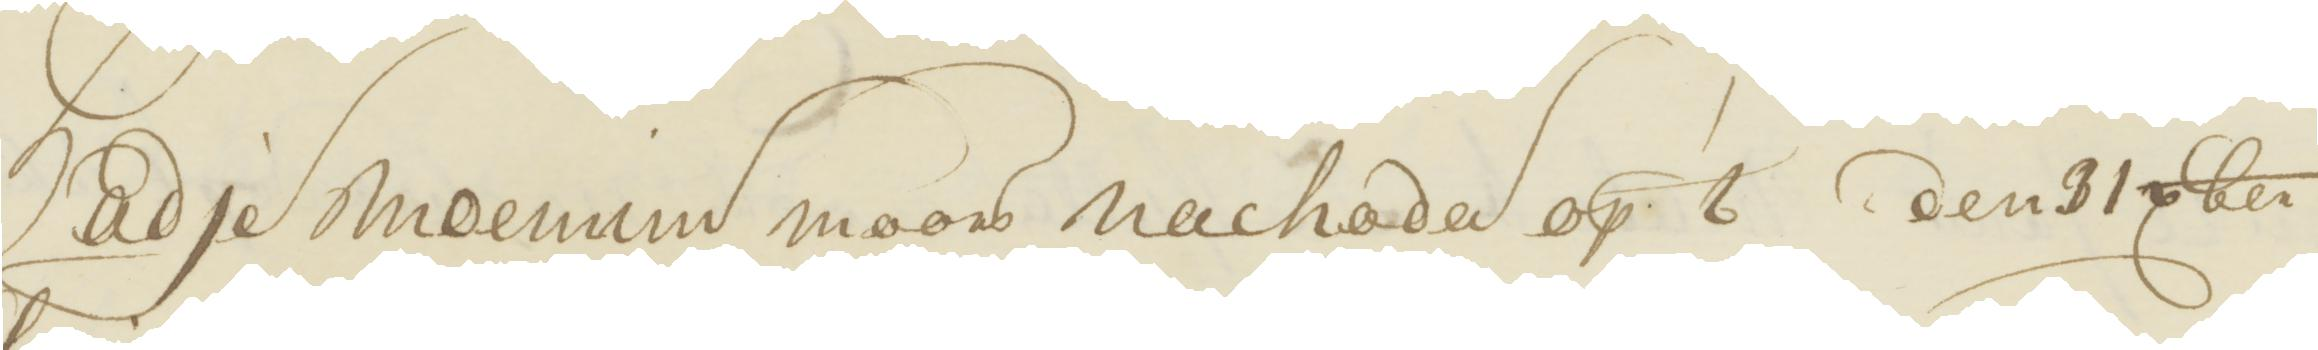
Hadje moemim moors nachoda op ’t den 31 xber
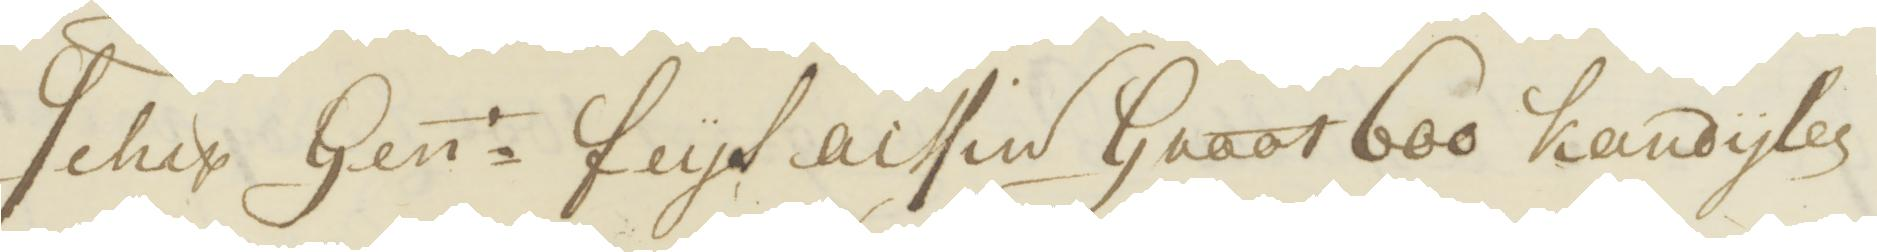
Schip Gen=t feijs aissin Groot 600 kandijlen
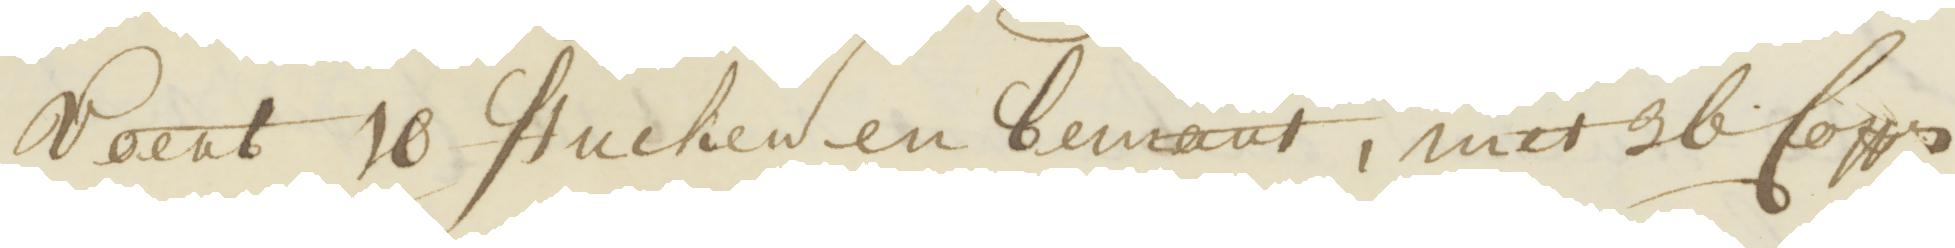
voert 10: stucken en bemant, met 36 Coppen
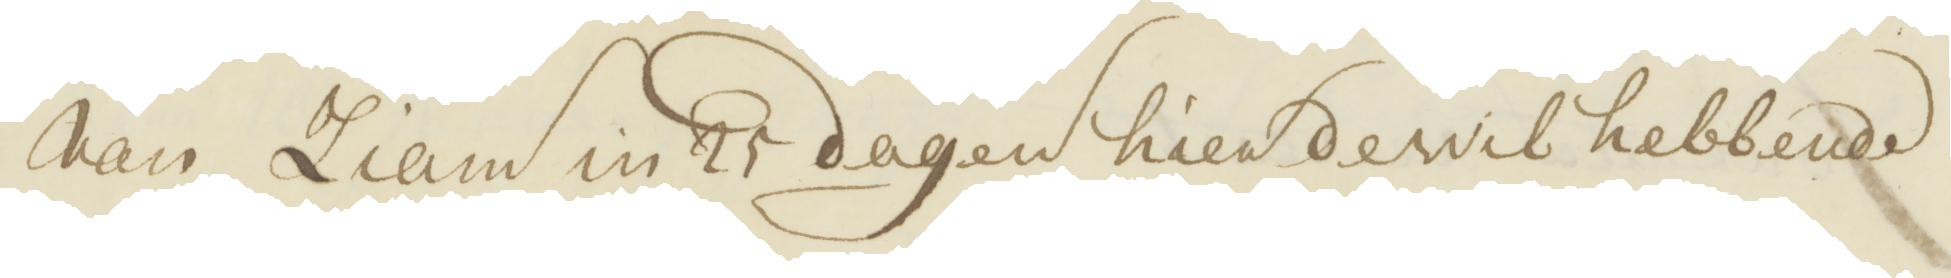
van Ziam in 25 dagen hier de wil hebbende
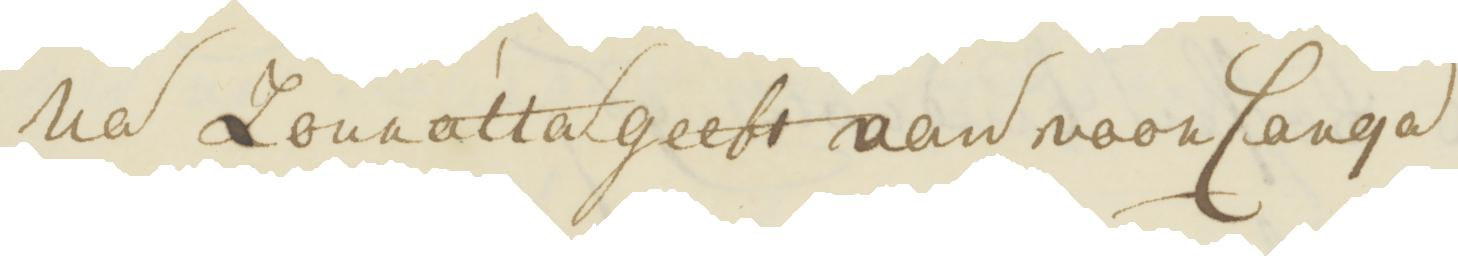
na Zouratta geeft van voor Carga
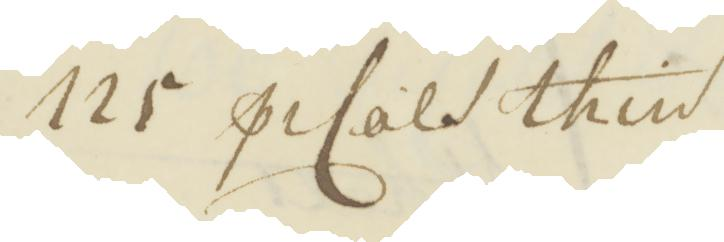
125 picals thin
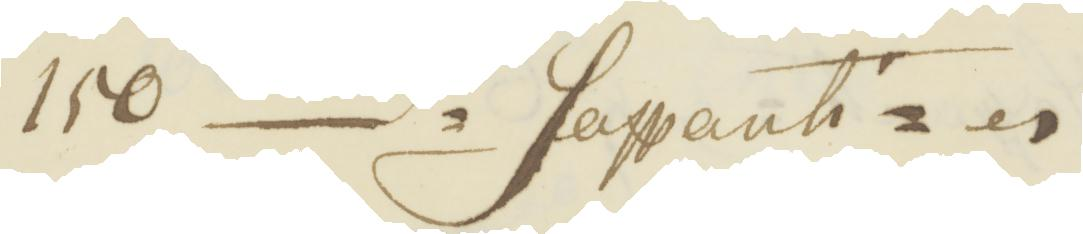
150 _=o Sapparh=t en
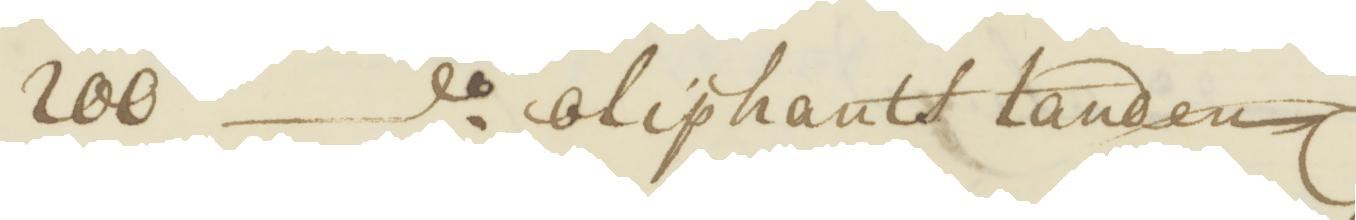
200 _-o oliphants tanden
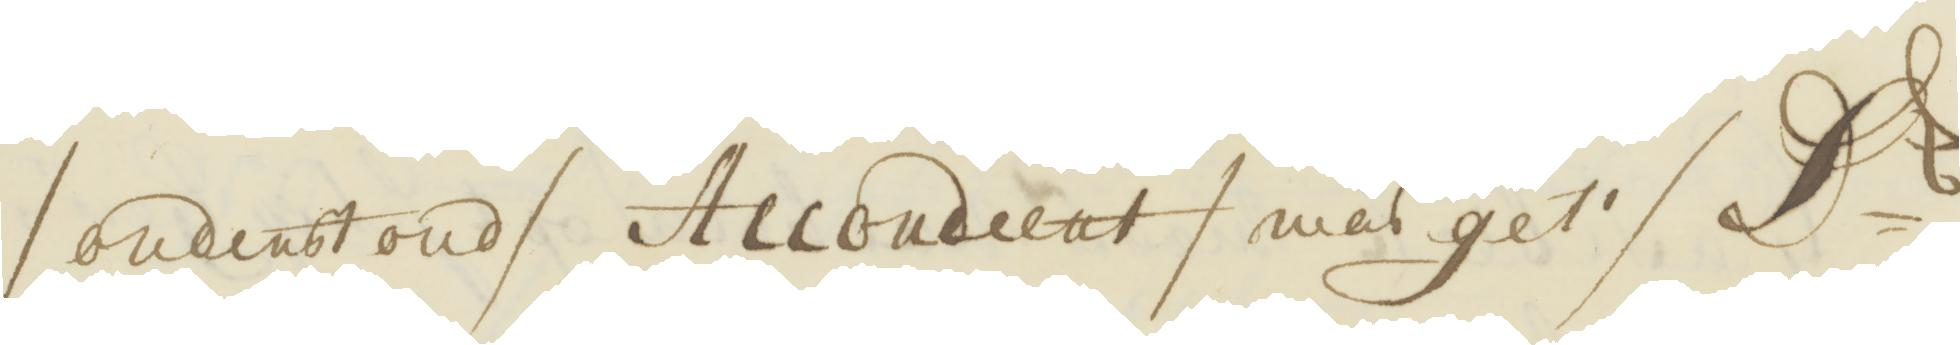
/onderstond/ Accordeert / was get'/ D=t
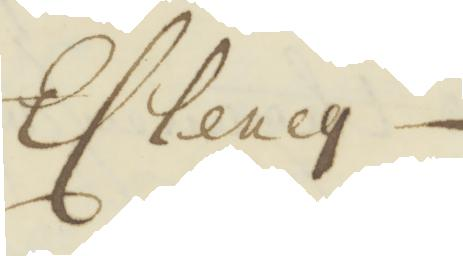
Eclercq
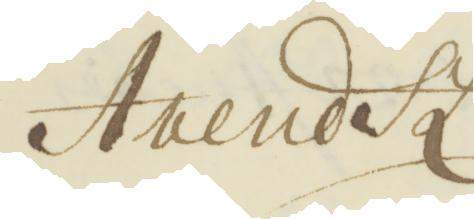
Arendsz
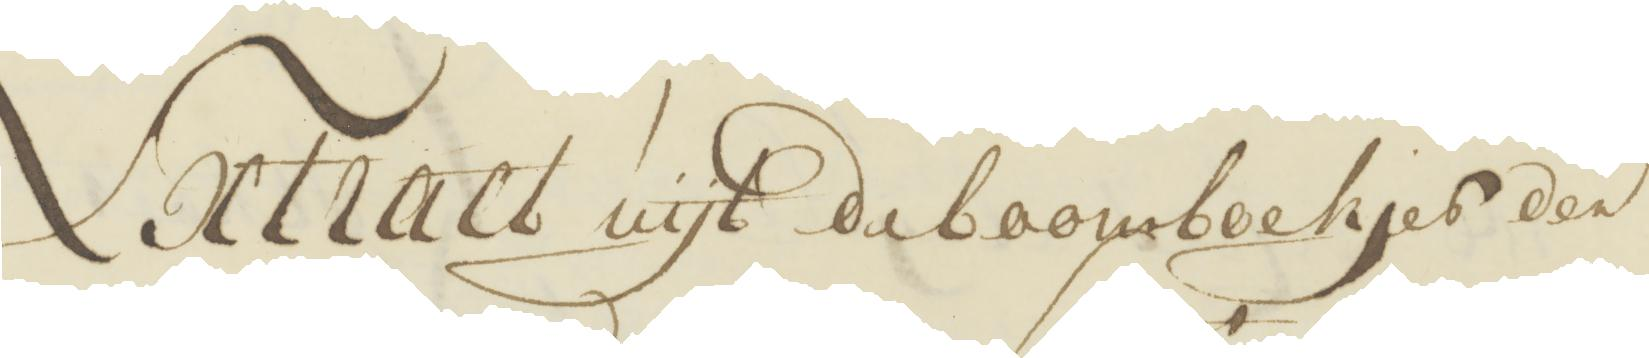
Extract uijt de boomboekjes der
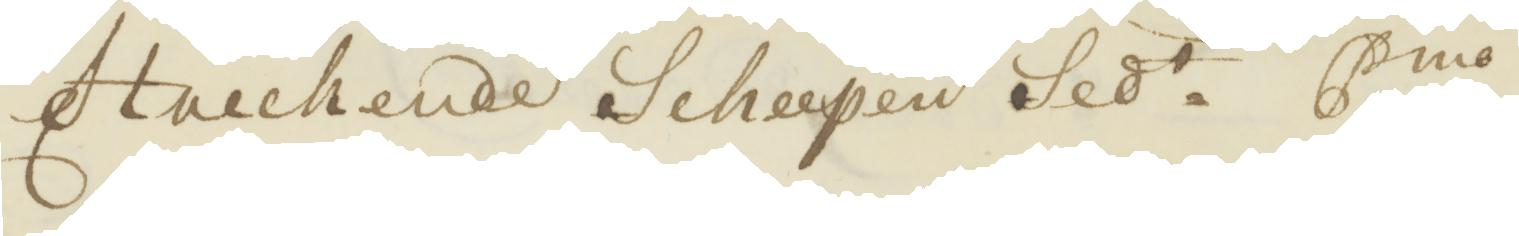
vertreckende scheepen sed=t P=mo
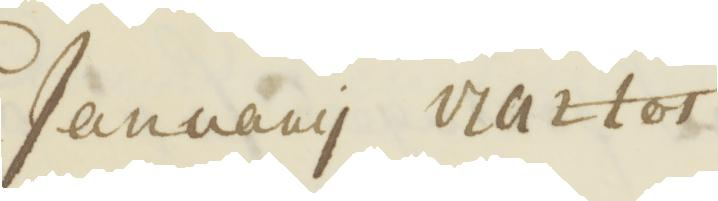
Januarij 1742 tot
